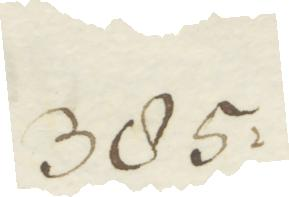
385:
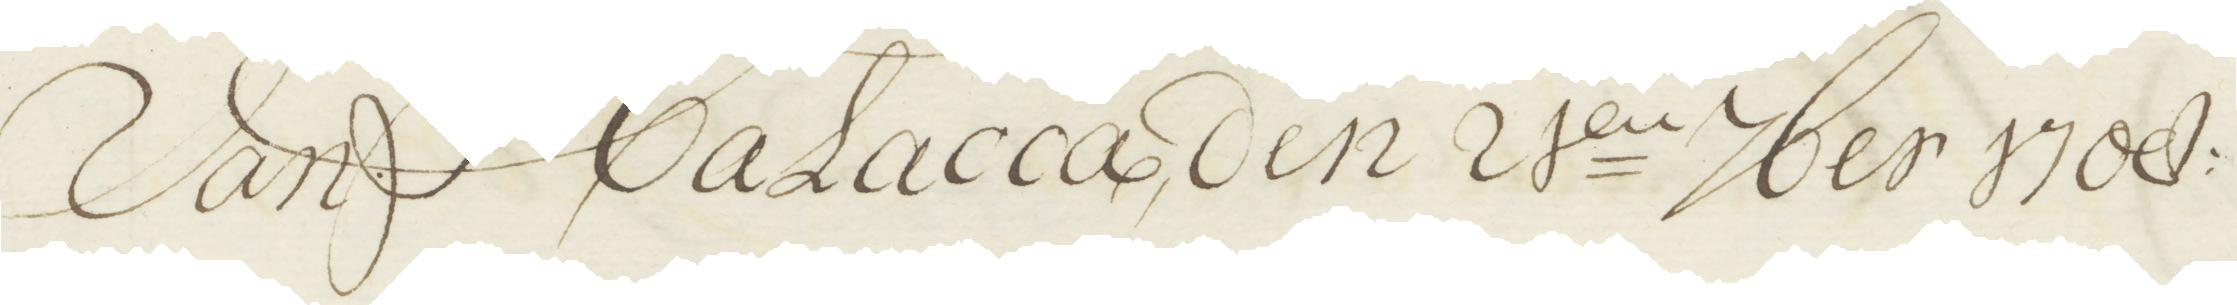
Van Malacca, den 21=en 7ber 1708:
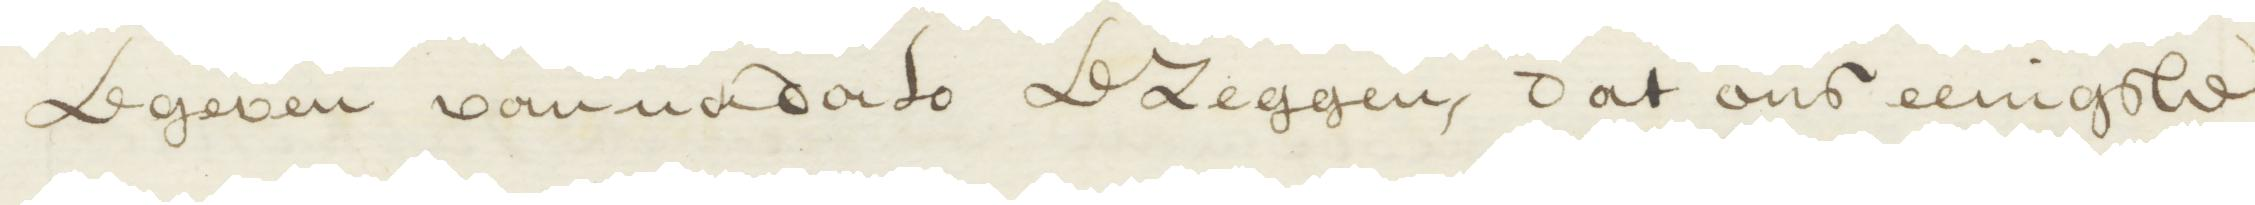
te geven van na dato te zeggen, dat ons eenigste
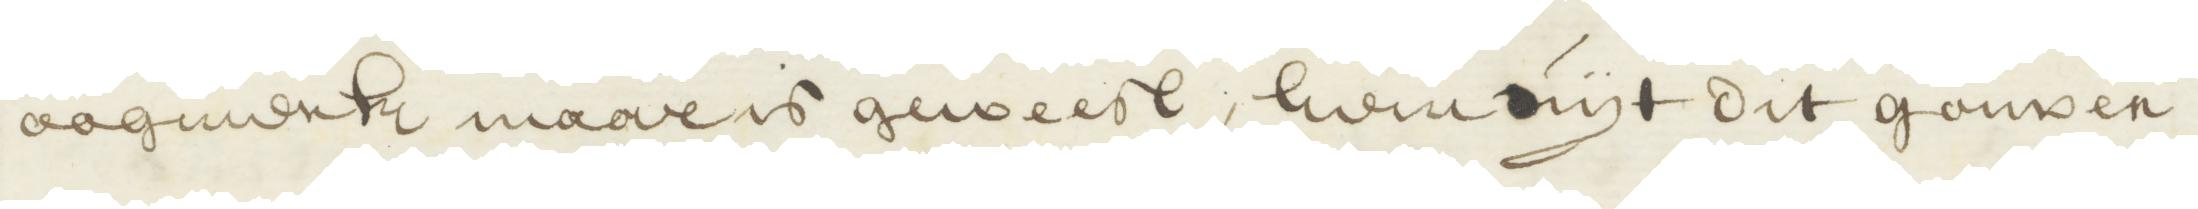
oogmerk maar is geweest, hem uijt dit gouver
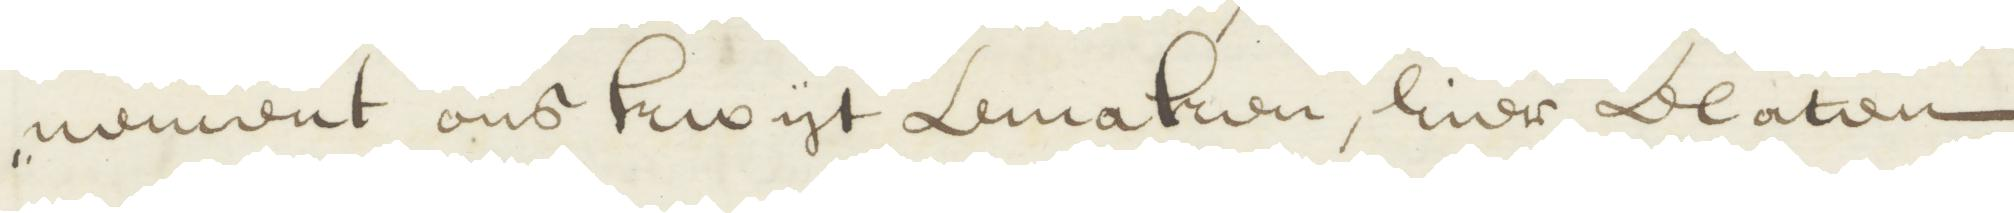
„nement ons kwijt temaken, hier telaten
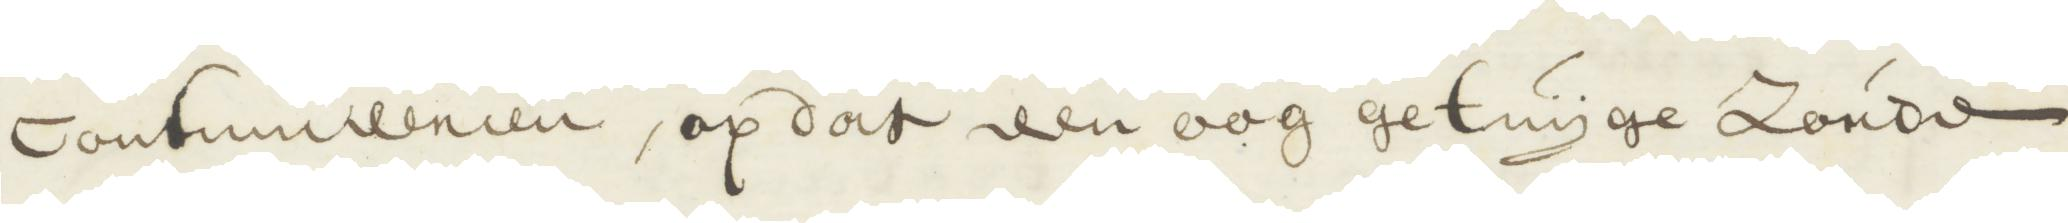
continueeren, op dat een oog getuijge zoude
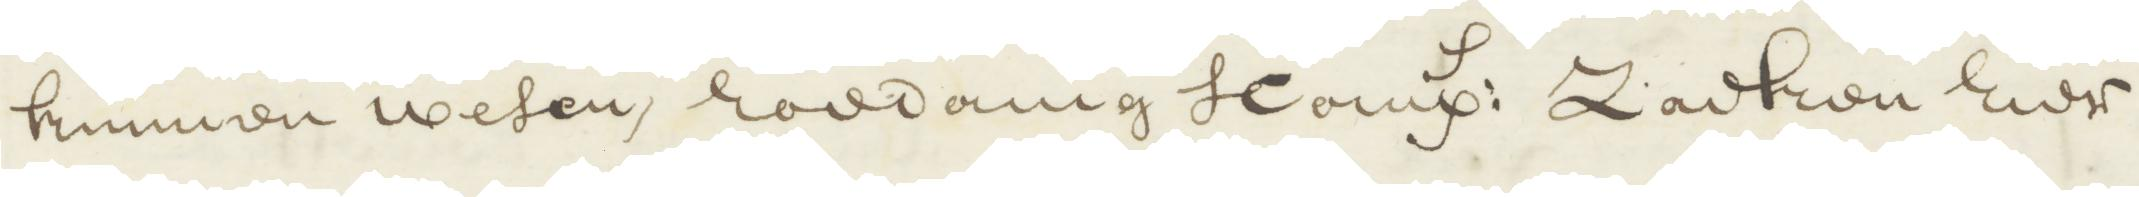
kunnen wesen, hoedanig 'scomp:s zaeken hier
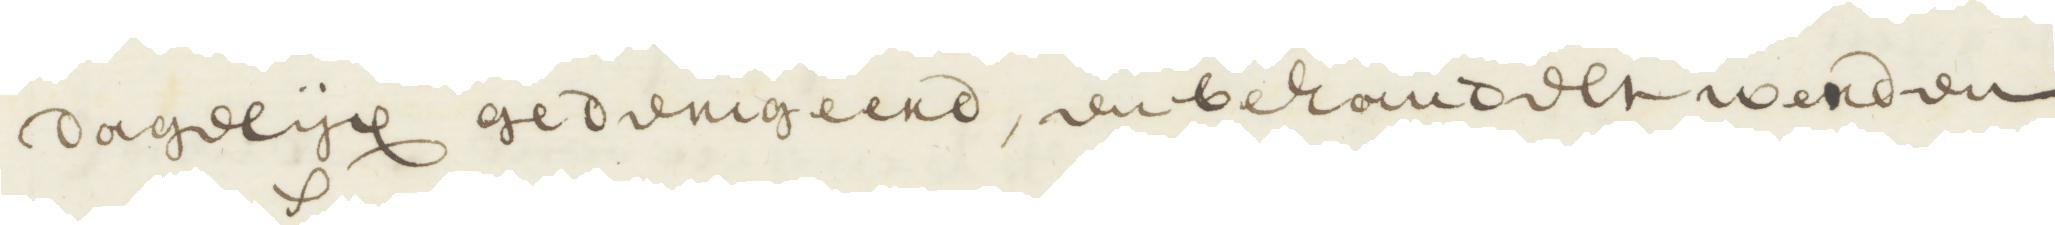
dagelijx gederigeerd, en behandelt werden
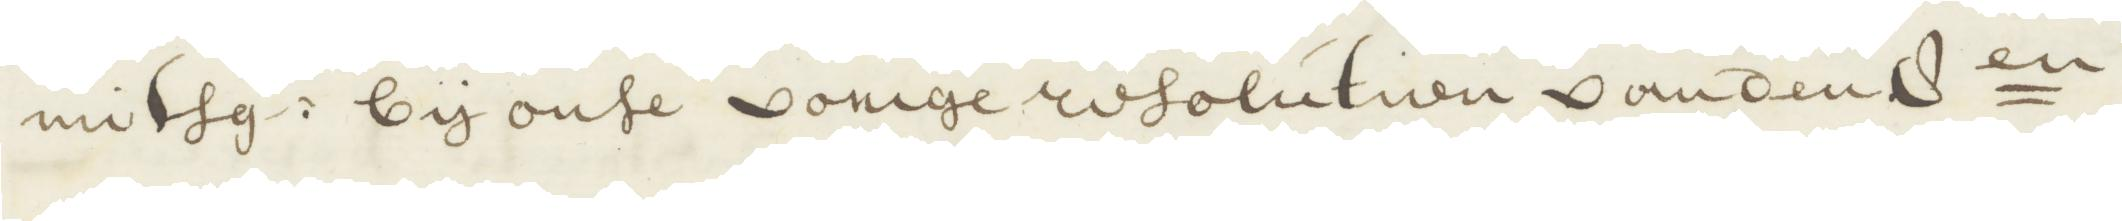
mitsg:s bij onse vorige resolutien van den 8=en
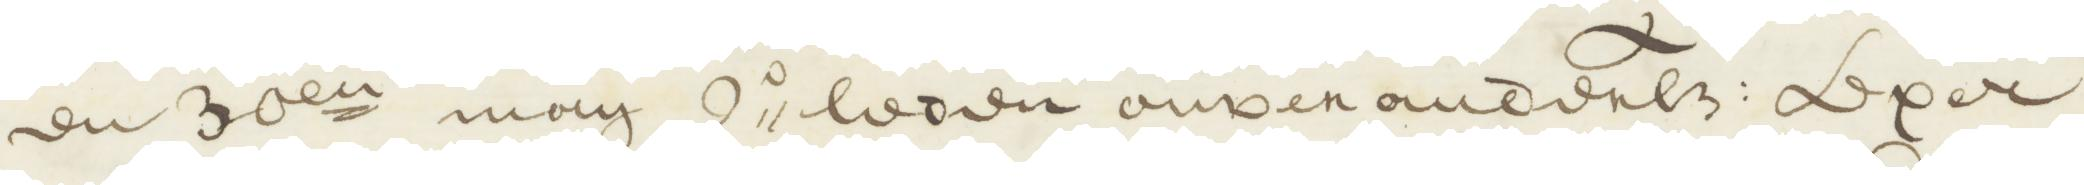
en 30=en maij J„o leden onveranderlijk te per
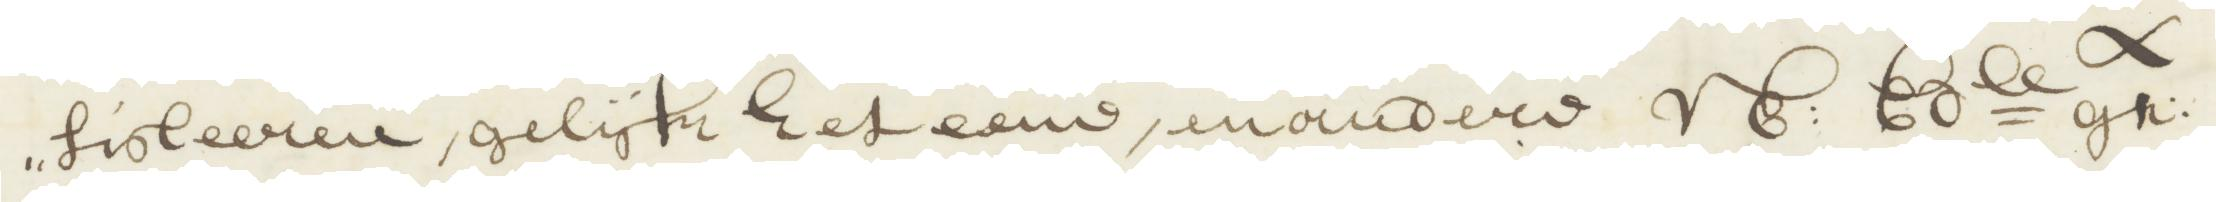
„sisteeren, gelijk het eene, en andere UE: Ed=le gr:
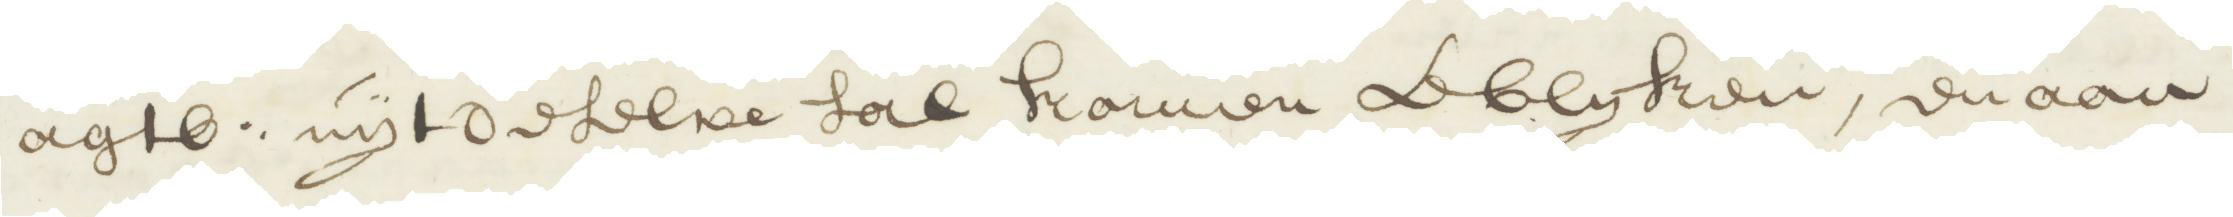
agtb: uijt deselve sal komen te blyken, en aan
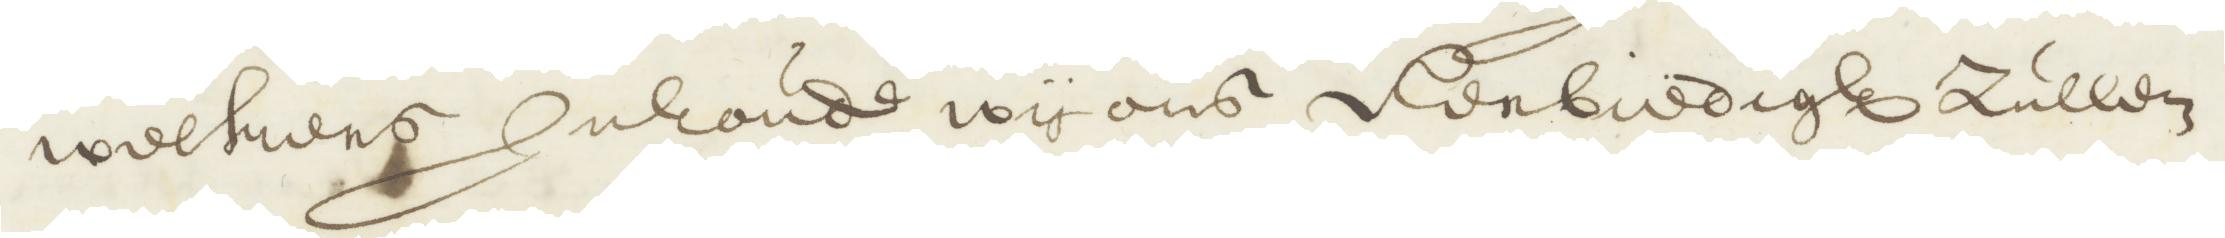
welkers Jnhoude wij ons Eerbiedigh zullen
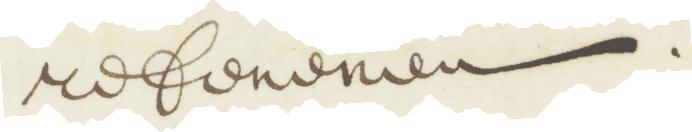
refereren.
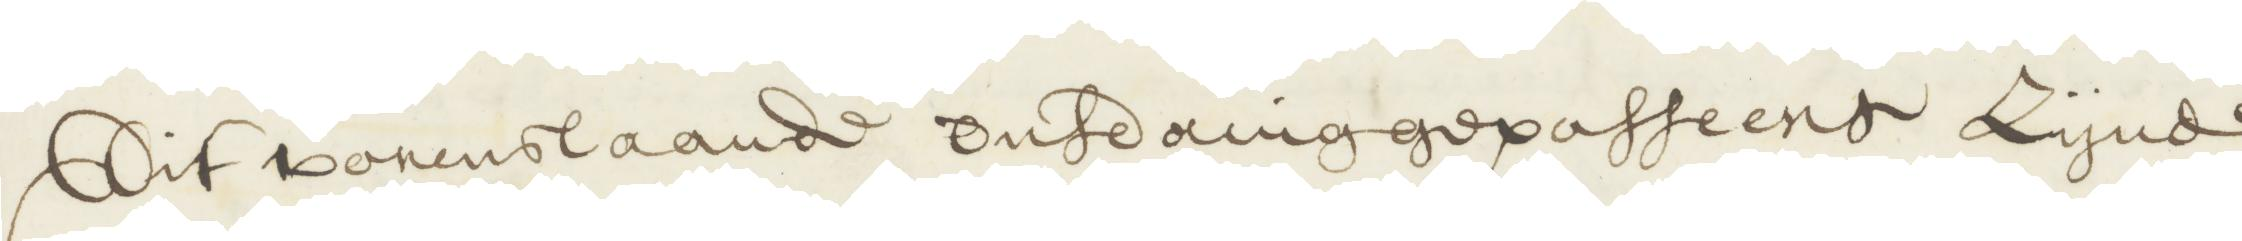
Dit vorenstaande dusdanig gepasseerd zijnde
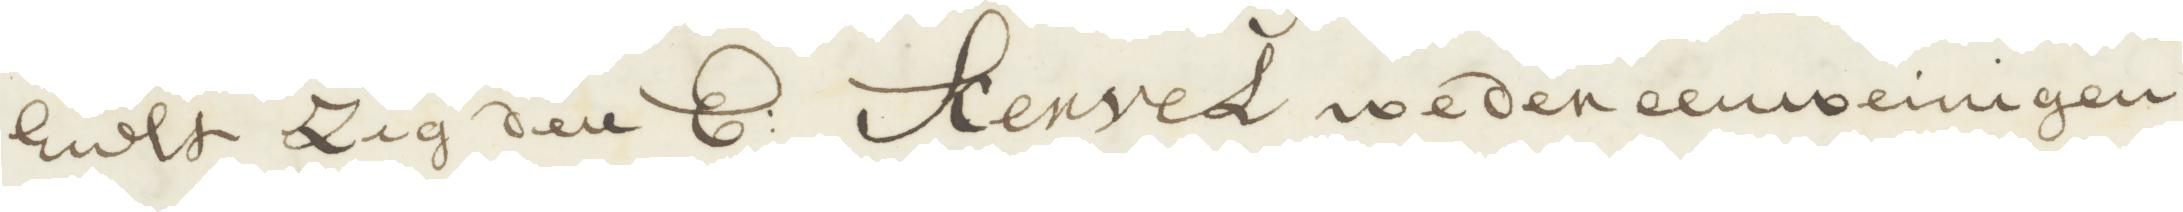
hielt zig den E: Kervel weder een weinigen
